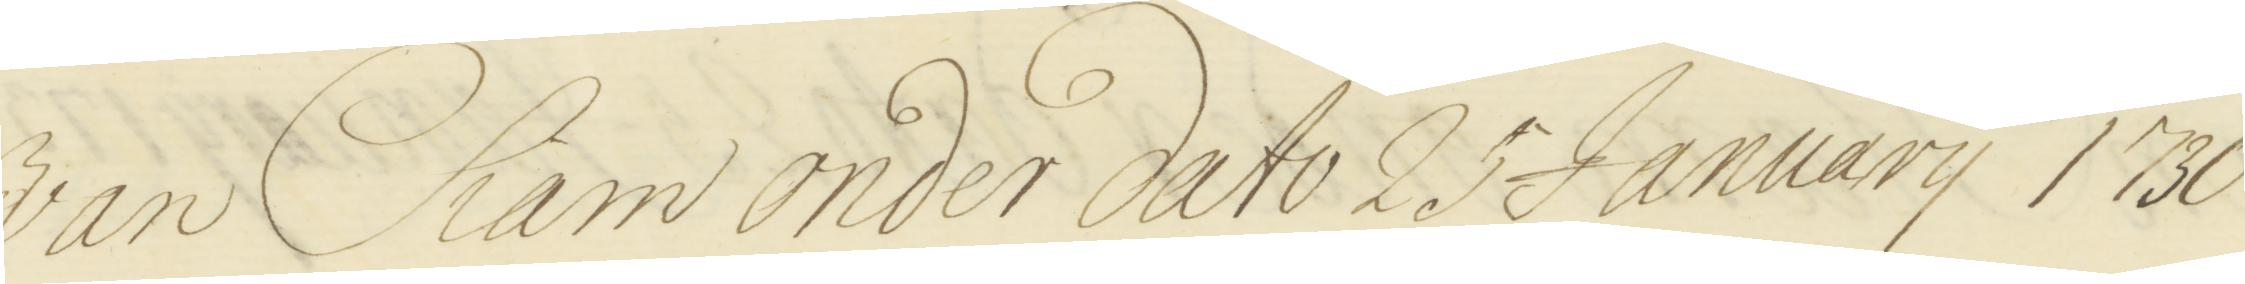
Van Siam onder dato 25 Januarij 1736
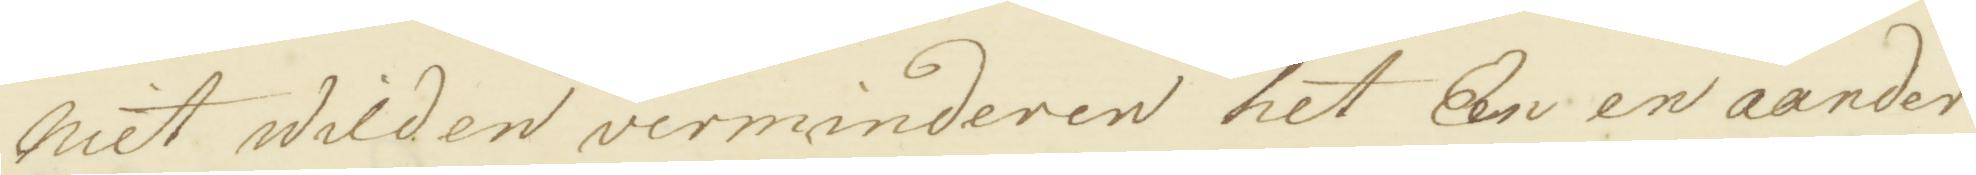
niet wilden verminderen het Een en aander
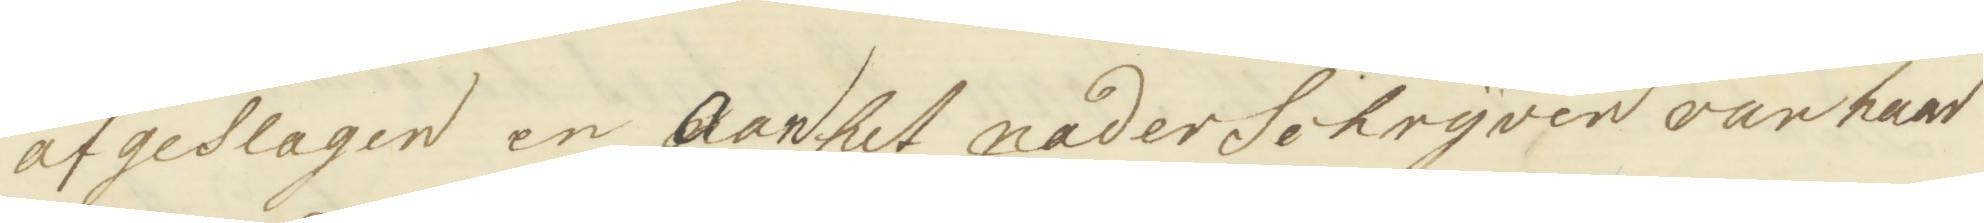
afgeslagen en aan het naderschrijven van haar
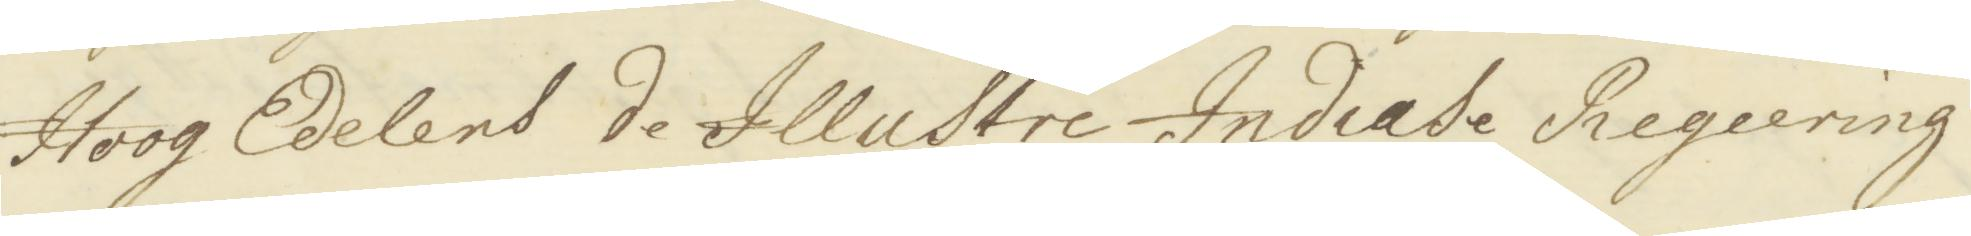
Hoog Edelens de Jllustre Jndiase Regeering
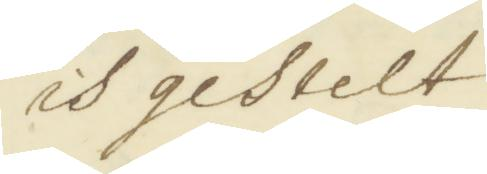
is gestelt
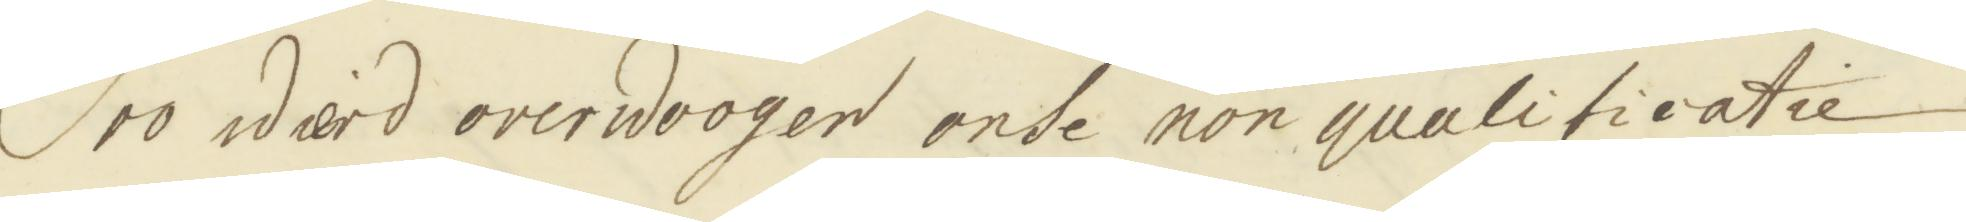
Soo wierd overwoogen onse non qualificatie
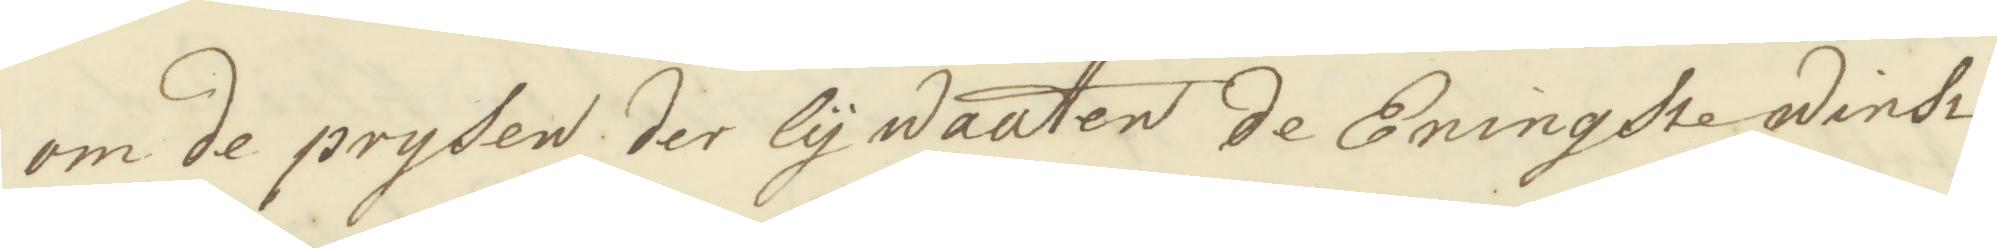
om de prysen der lijwaaten de Eningste winst
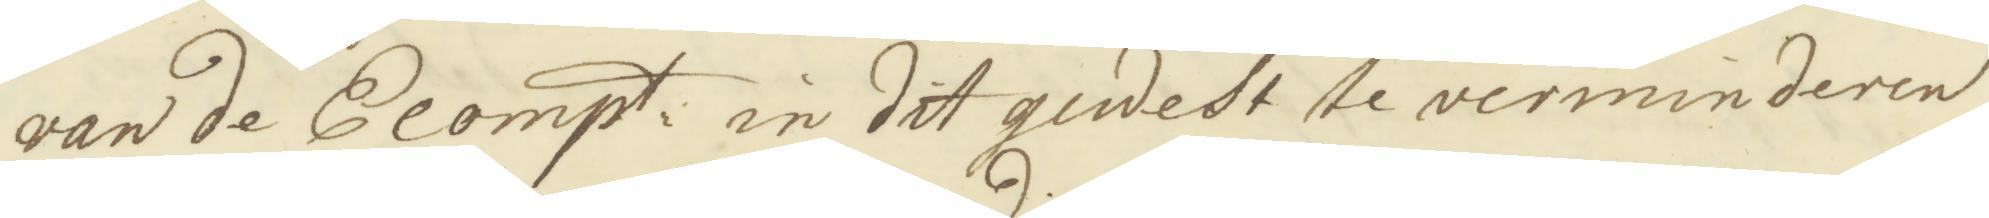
van de Ecomp:t in dit gewest te verminderen
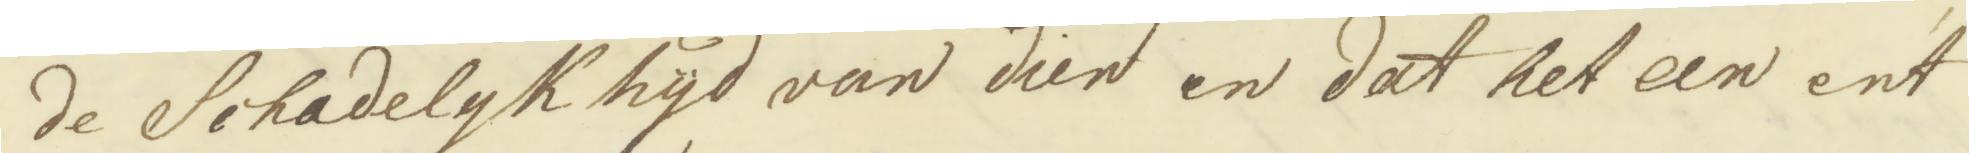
de schadelykhijd van dien en dat het een en't
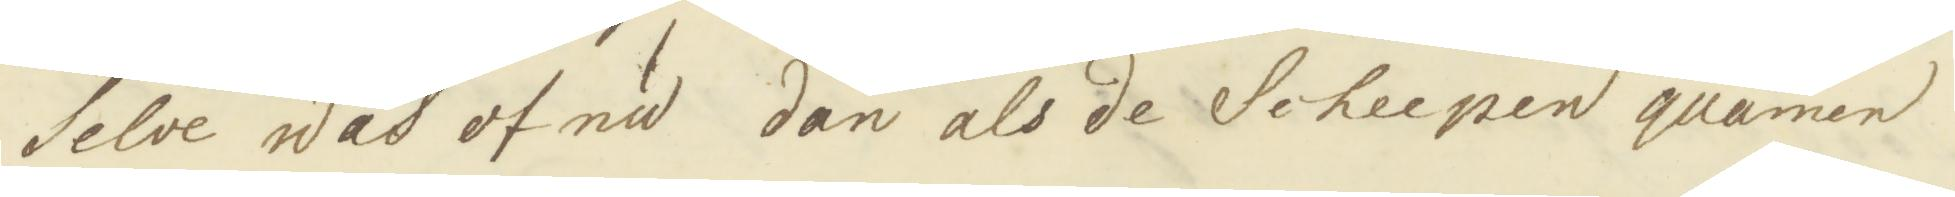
selve was of nu dan als de scheepen quamen
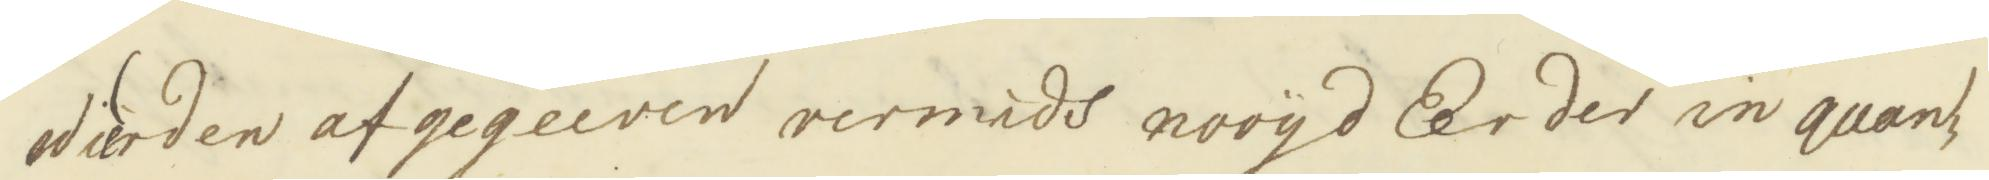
wierden afgegeeven vermids nooijd Eerder in quan
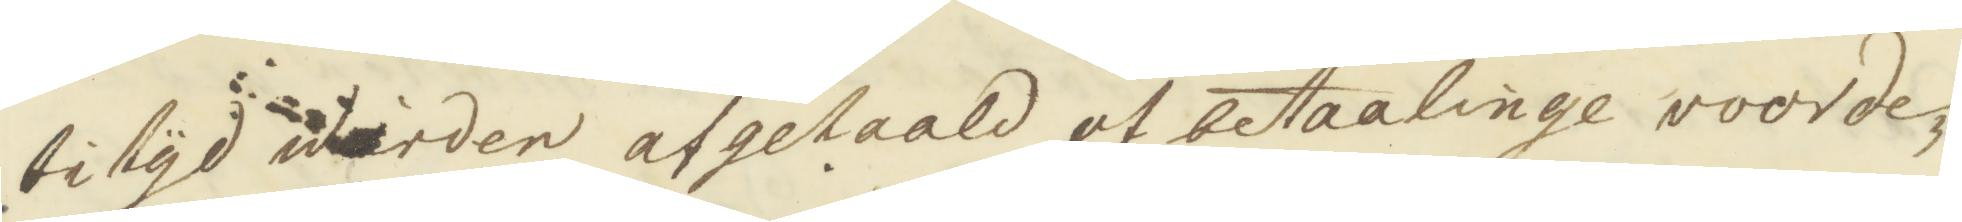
titijd werden afgehaald of betaalinge voor de„
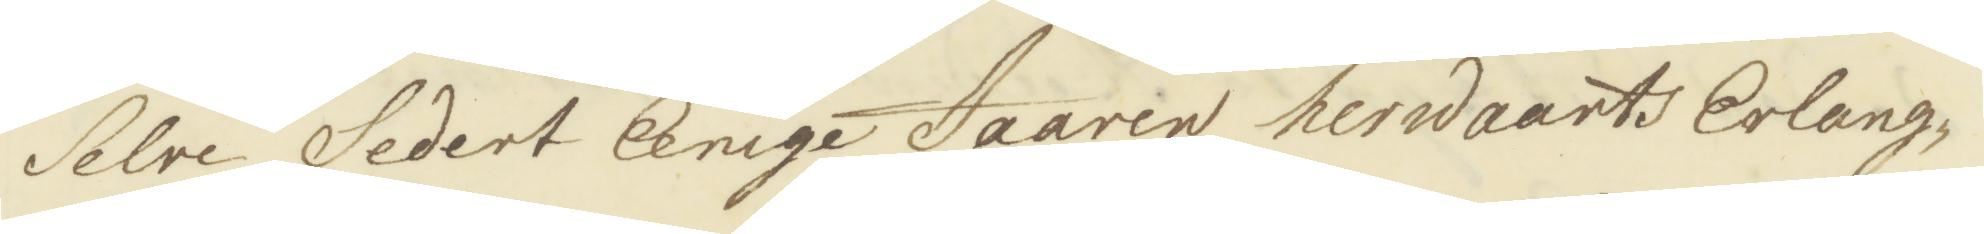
selve sedert eenige Jaaren herwaarts Erlang„
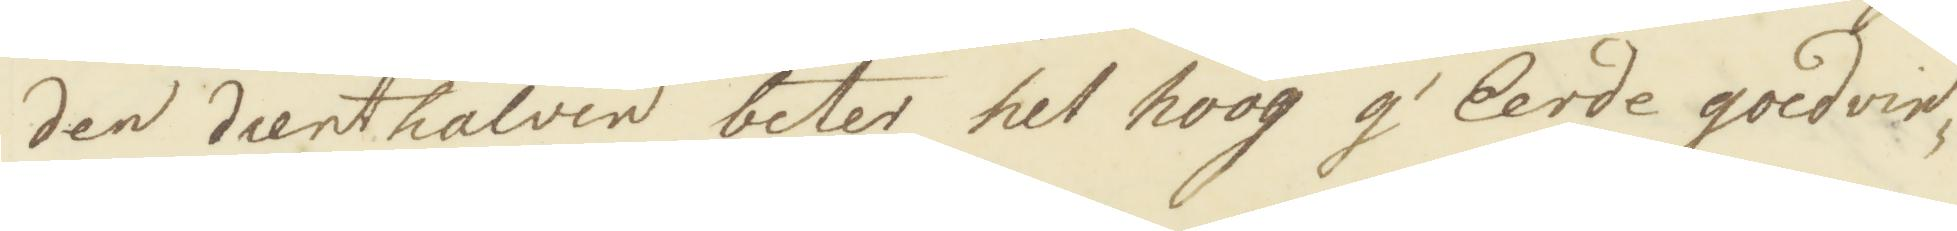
den dienthalven beter het hoog g’Eerde goedvin„
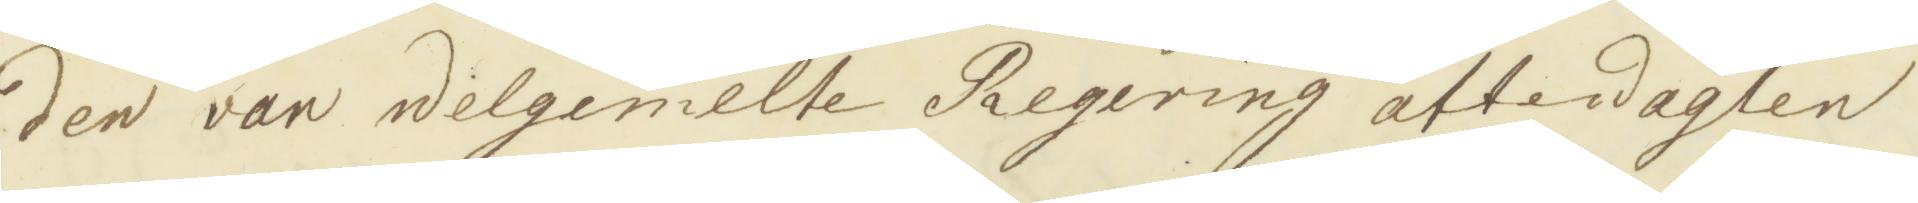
den van welgemelte Regering aftewagten
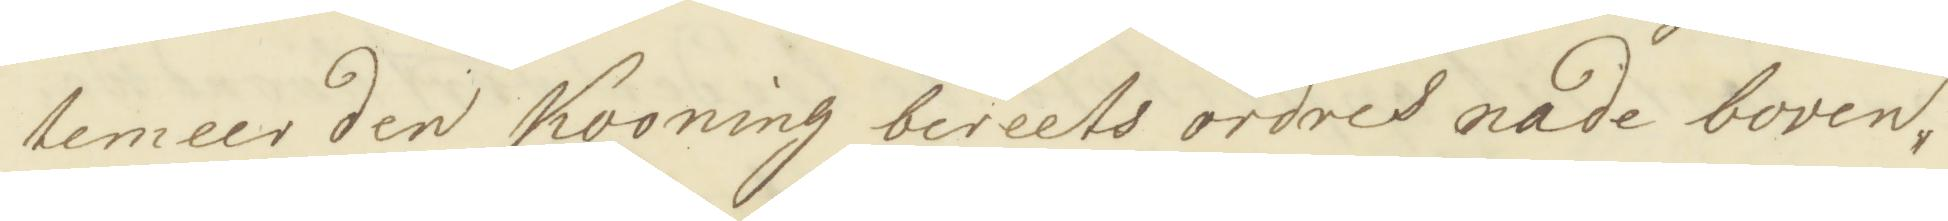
temeer den kooning bereets ordres nade boven„
